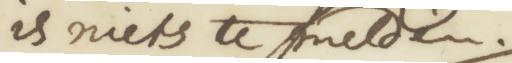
is niets te melden.
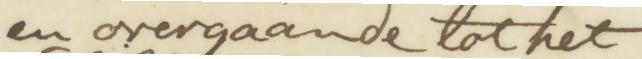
en overgaande tot het
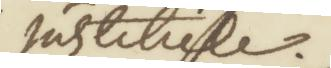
Justitiele.
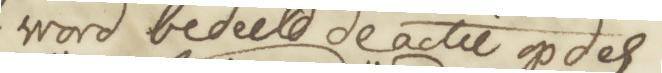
word bedeeld de actie op des
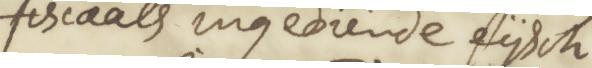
fiscaals ingediende eijsch
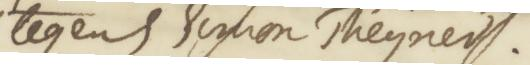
tegens Simon Theijner.
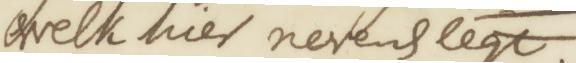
welk hier nevens legt.
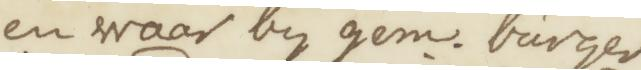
en waar bij gem. burger
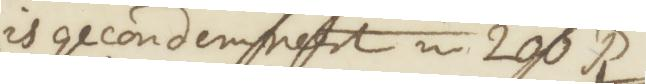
is gecondemneert in 200 R=
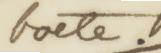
boete.
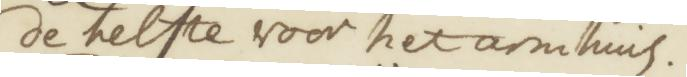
de helfte voor het armhuis.
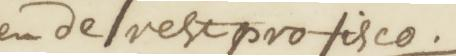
en de rest profisco.
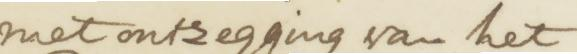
met ontzegging van het
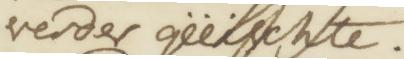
verder geëischte
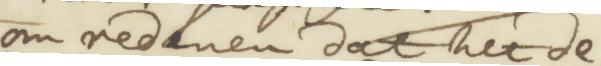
om redenen dat het de
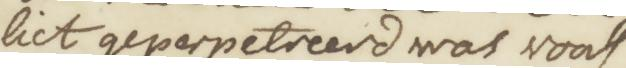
lict geperpetreerd was voor
